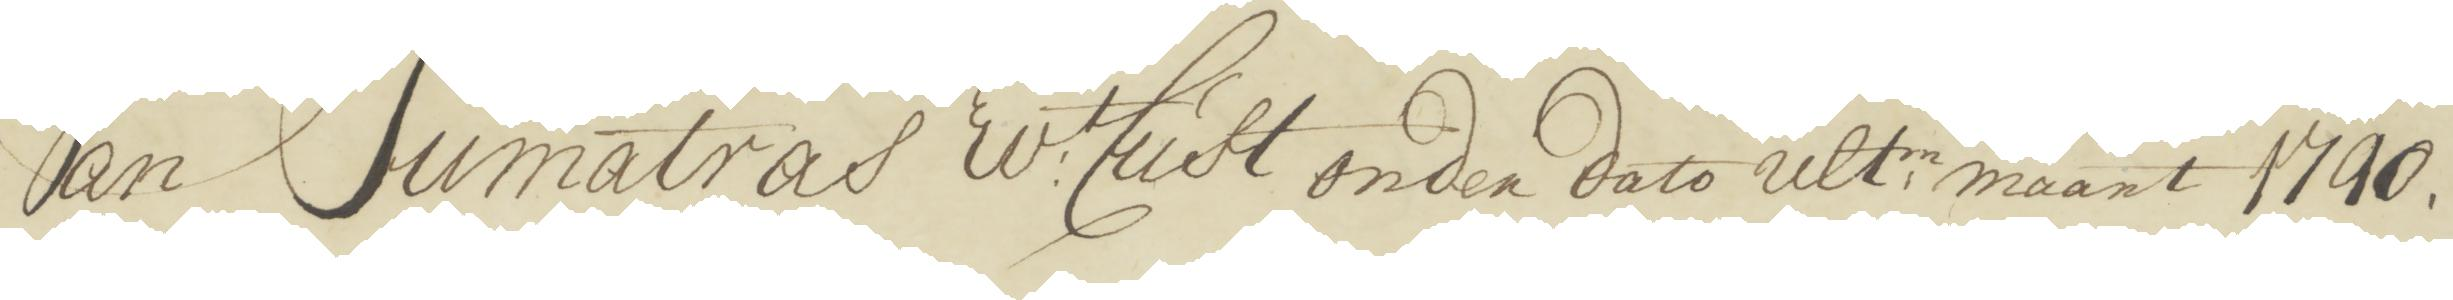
Van Sumatras w:t Cust onder dato ult.m maart 1740.
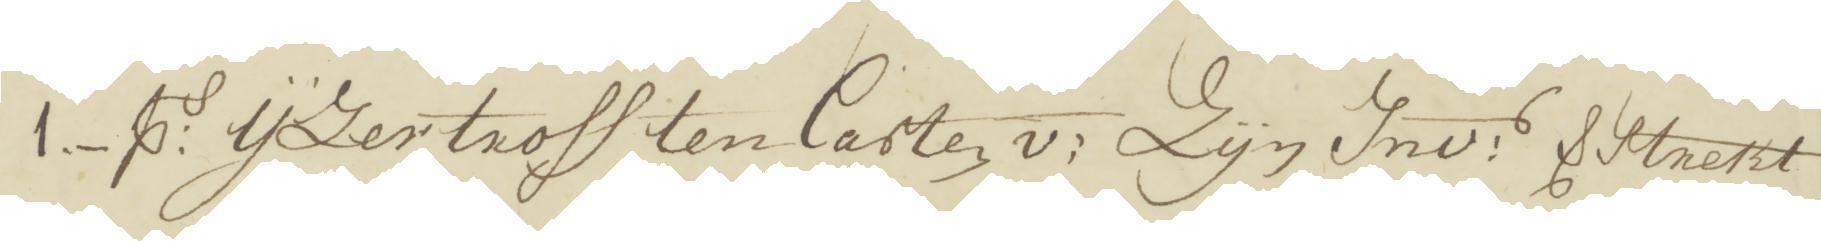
1.– p:s ijzer tross ten Casten v: zijn Inv:s verstrekt
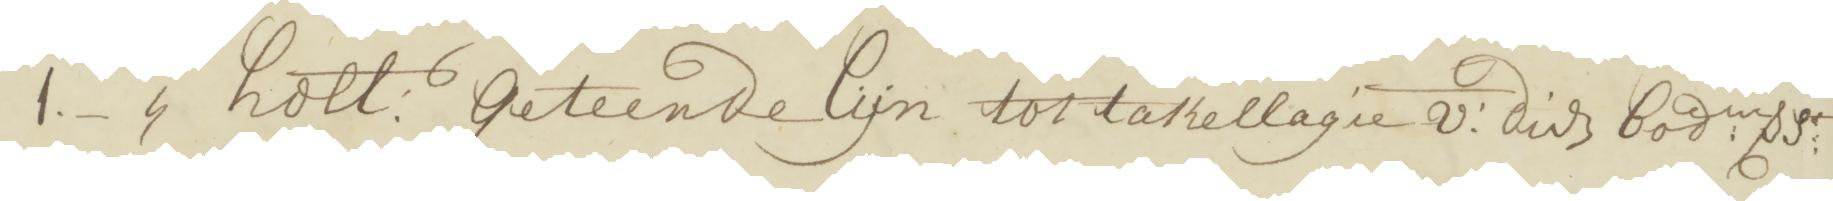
1.– „ holl:s geteerde lijn tot takellagie v: dien bod:m vers:t
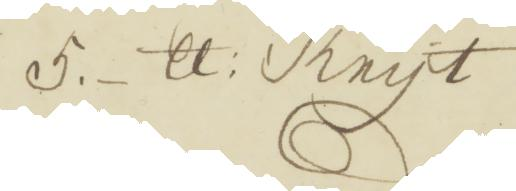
5.– lb: Krijt
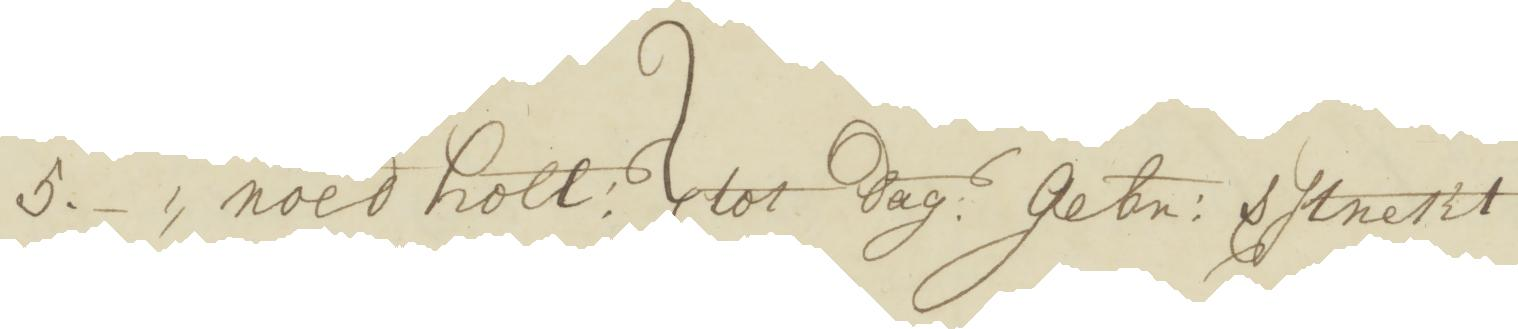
5.– „ roed holl: tot dag:s gebr: verstrekt
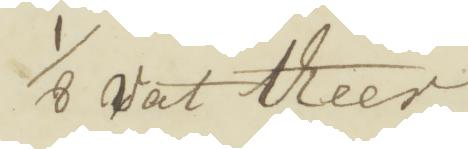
1/8 vat theer
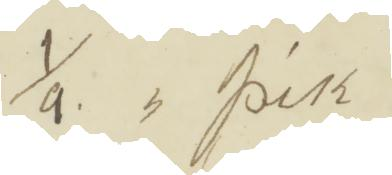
¼. „ pik
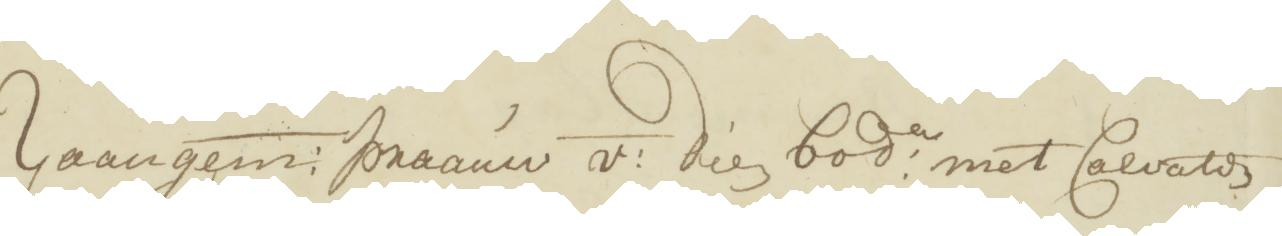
aan gem: praauw v: dien bod:en met Calvaten
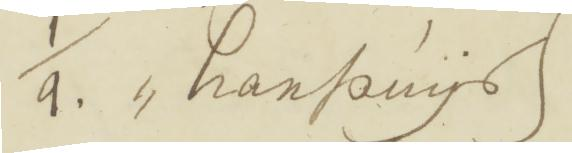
¼. „ harpuijs
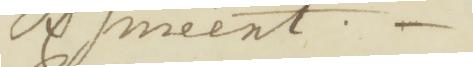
versmeert. —
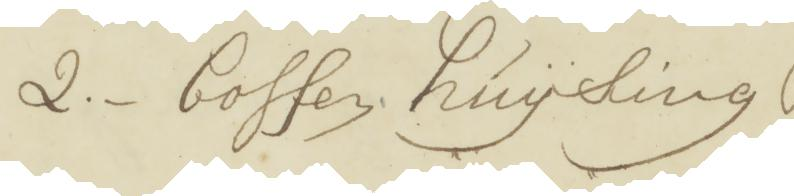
2.– bossen huijsing
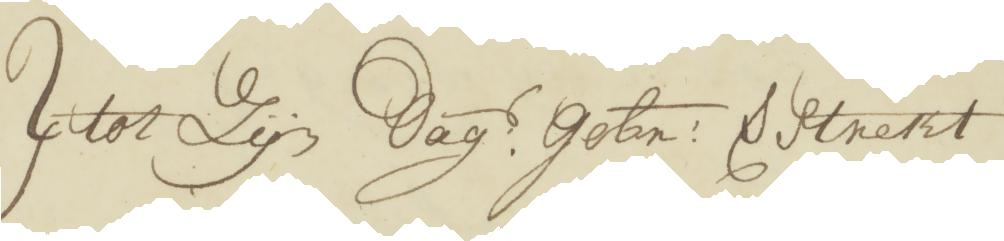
} tot zijn dag:s gebr: verstrekt
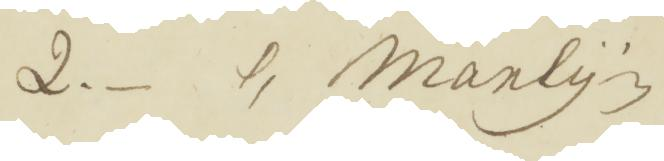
2.– „ marlijn
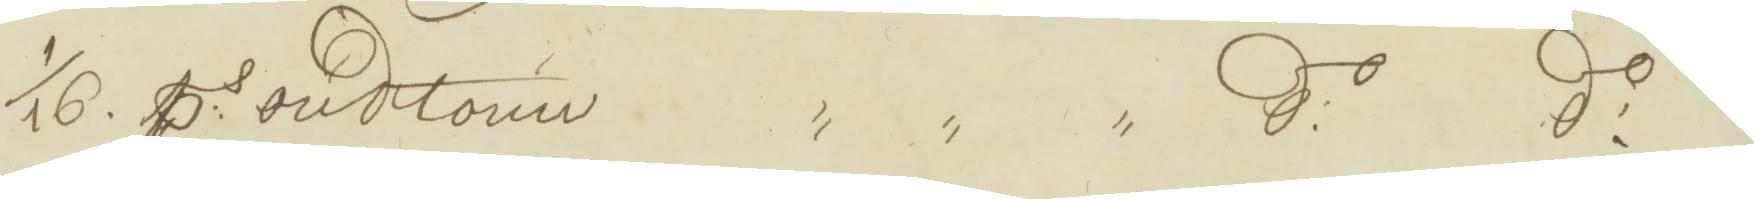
1/16. p:s oudtouw „ „ „ d:o d:o
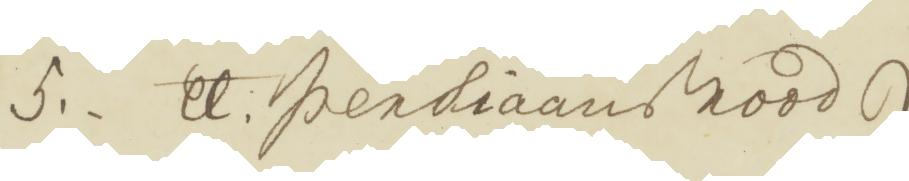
5.- lb: persiaans rood
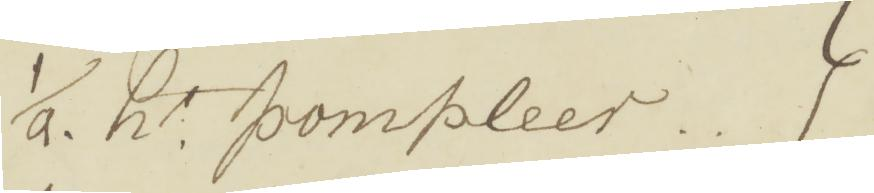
¼. h:t pompleer. }
